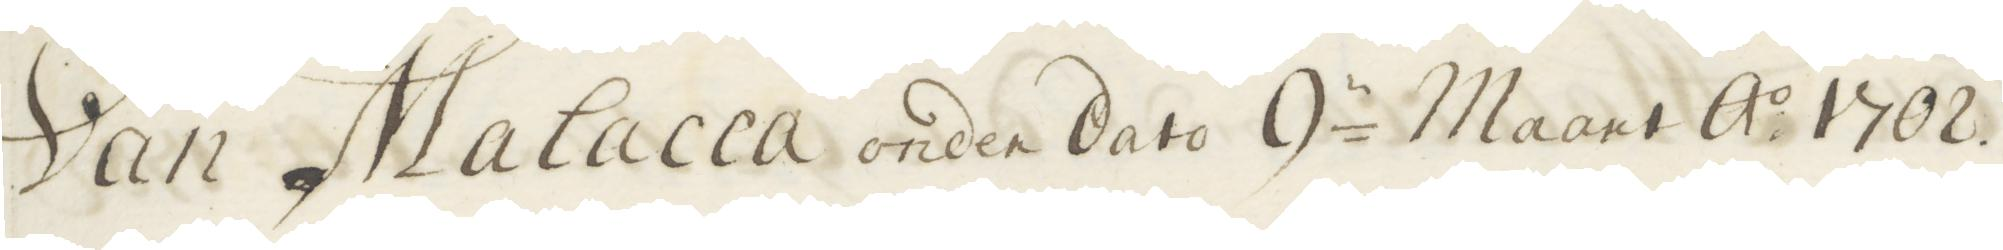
Van Malacca onder dato 9=n Maart A:o 1702.
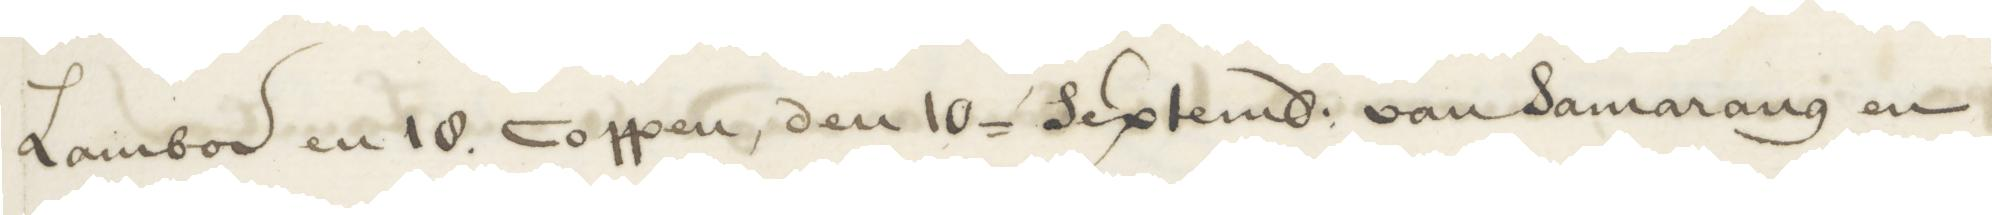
Lamboe en 18. coppen, den 10=' Septemb: van Samarang en
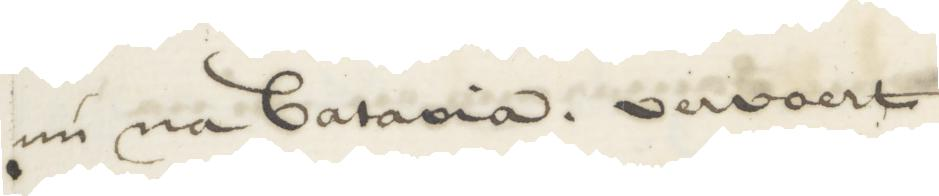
nu na Batavia. vervoert
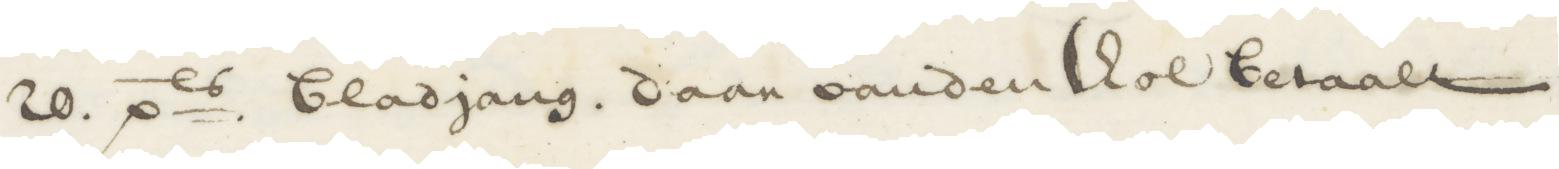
20. p=es. bladjang. daar van den thol betaalt
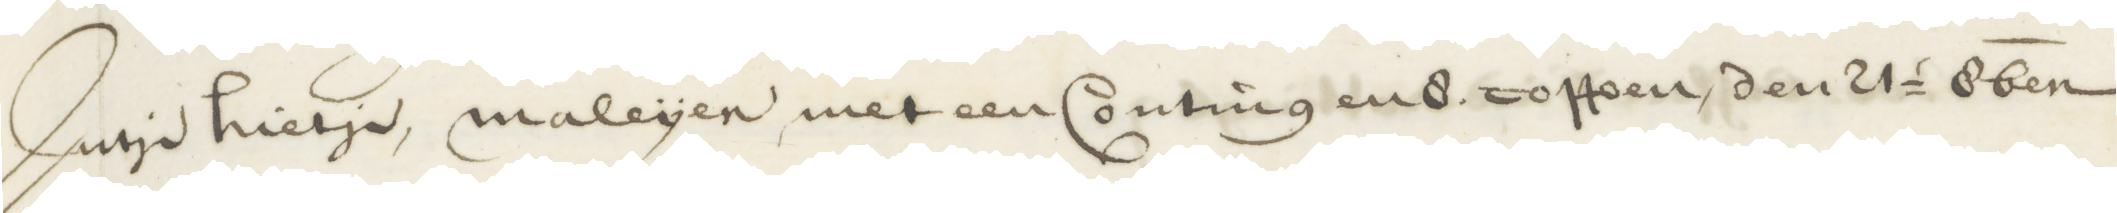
Jntje kietje, maleijen, met een Conting en 8. coppen, den 21=' 8ber
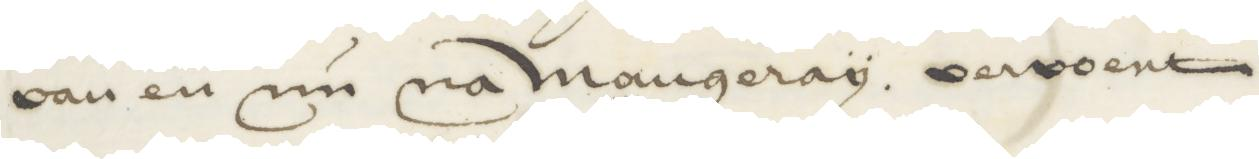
van en nu na Mangeraij. vervoert
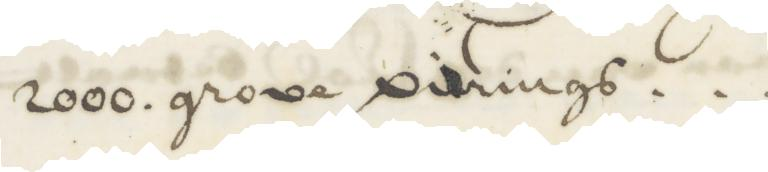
2000. grove pierings . . . . .
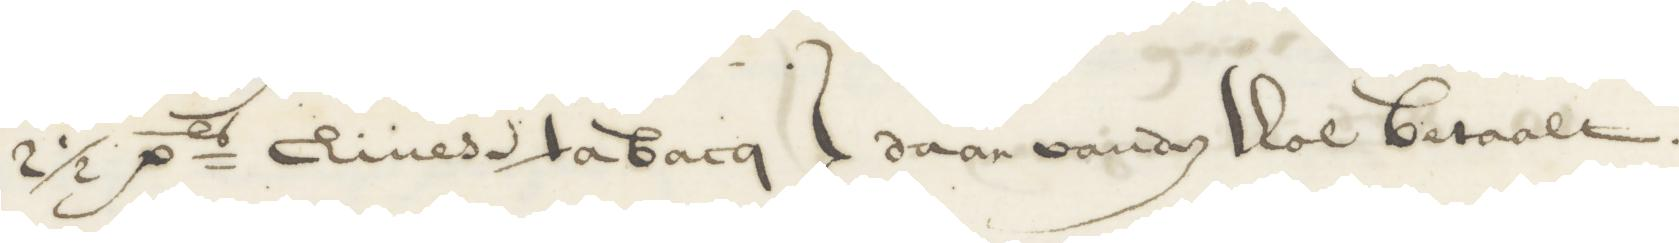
2½ p=es chinese tabacq daar vanden thol betaalt.
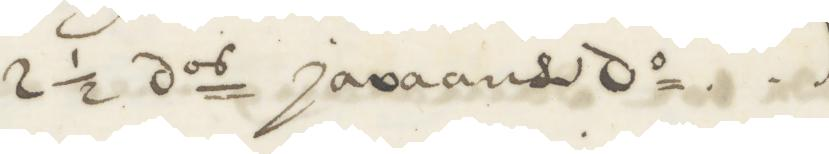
2 ½ d=os javaanse d=o . .
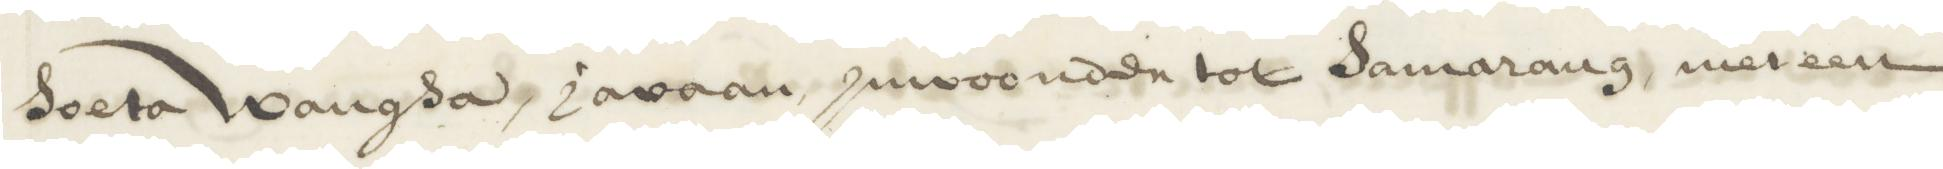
Soeta Wangsa, javaan, jnwoonder tot Samarang, met een
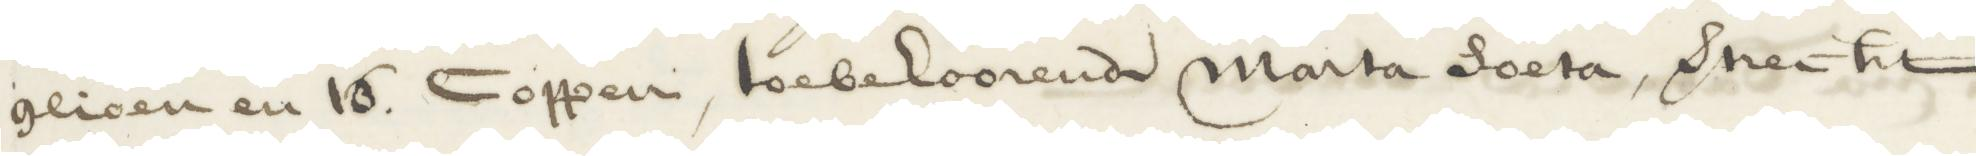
glioen en 16. Coppen, toebehoorende Marta Soeta, vertreckt
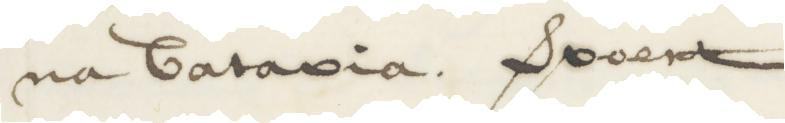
na batavia. vervoert
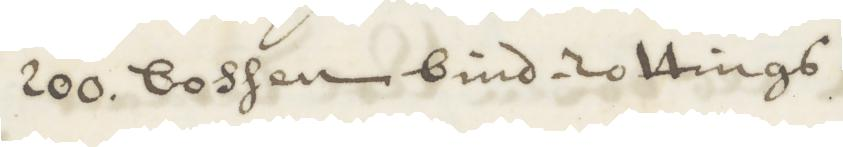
200. bossen bind-rottings
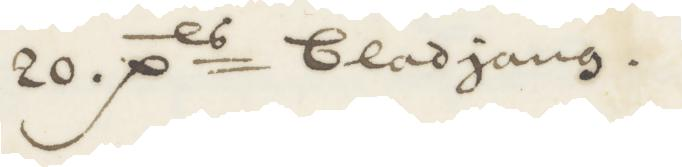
20. p=es bladjang. . . .
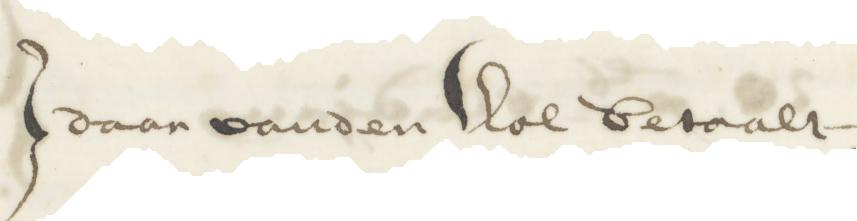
daar vanden thol betaalt
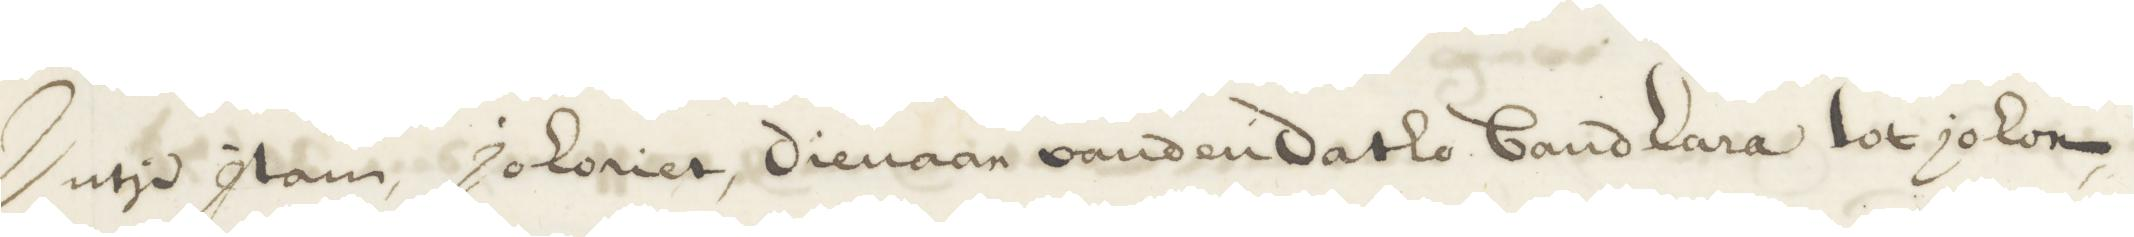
Jntje jtam, johoriet, dienaar vanden datho bandhara tot johor,
